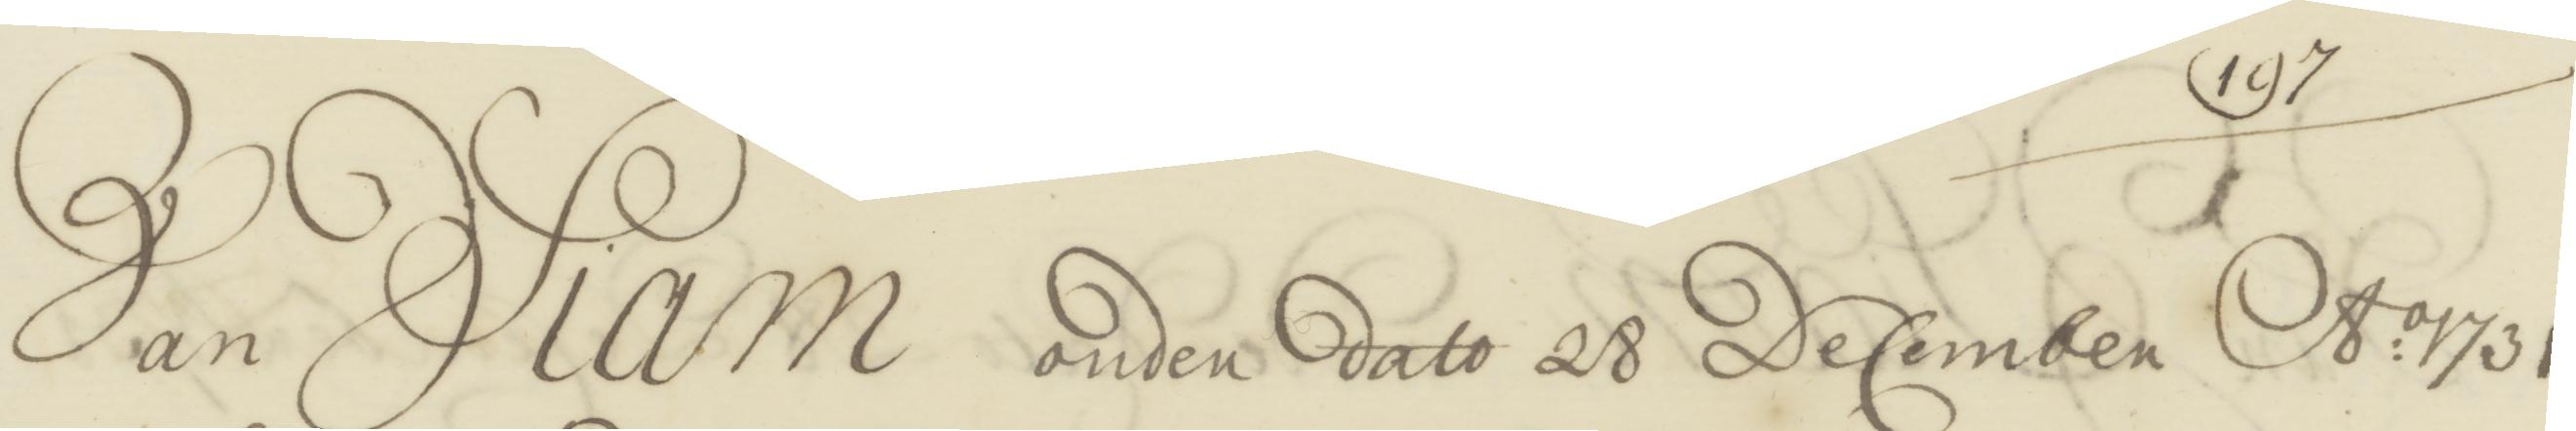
Van Siam onder dato 28 Decmber A:o 1731
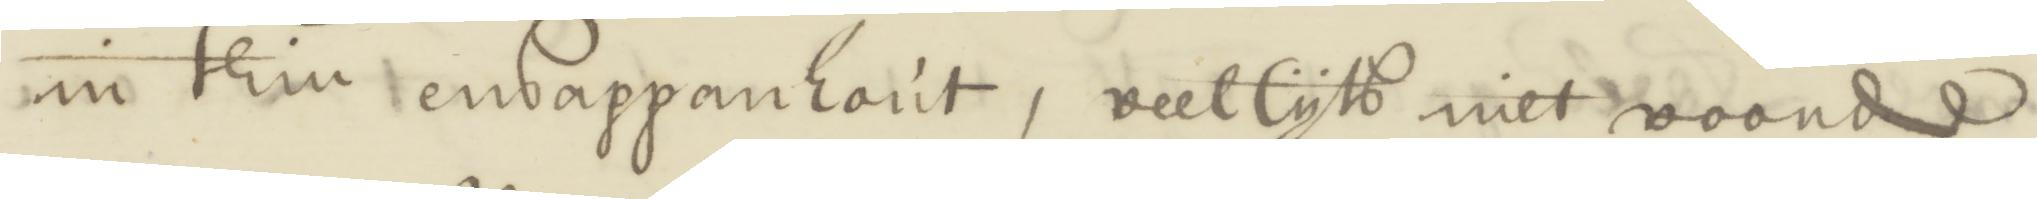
in thin en sappanhout, veel tijts niet voorde
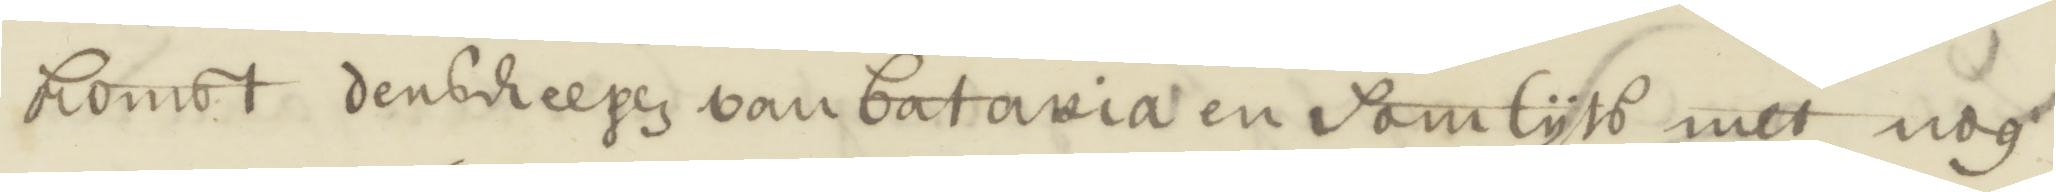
komst den scheepen van batavia en somtijts met nog
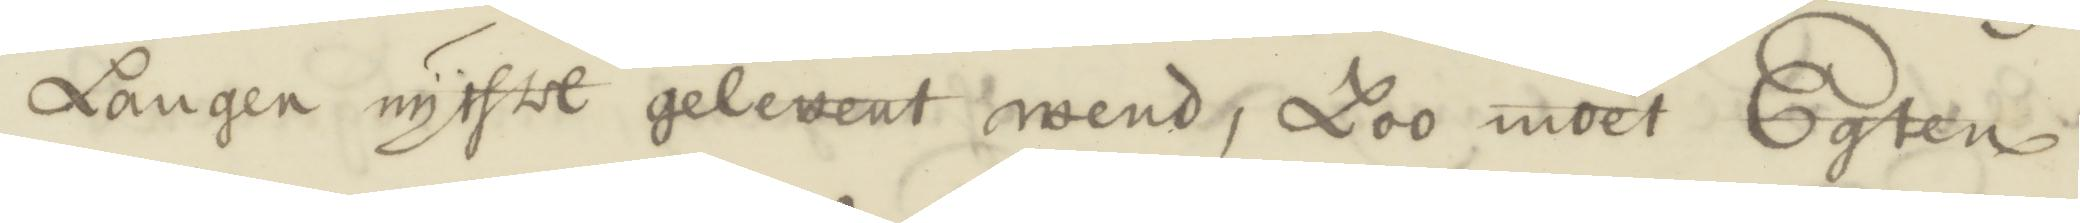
Langer uijtstel gelevert werd, zoo moet Egter
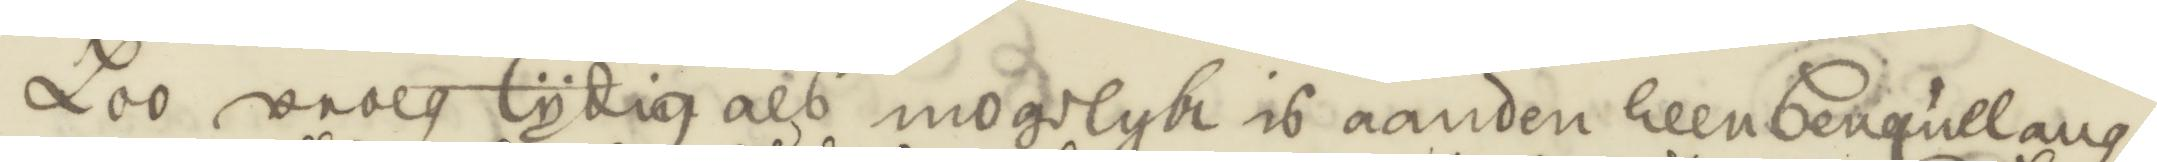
zoo vroeg tijdig als mogelijk is aan den heer berquelang
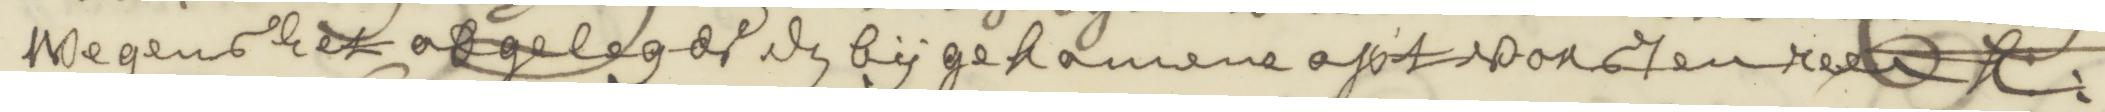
wegens het afgelegde en bij gekomene op't vorsten reeck=
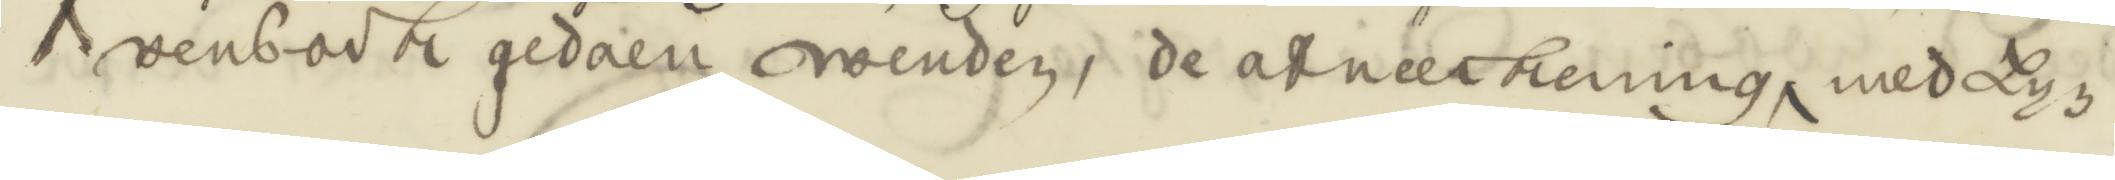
^ versoek gedaen werden, de afreeckening, med zyn
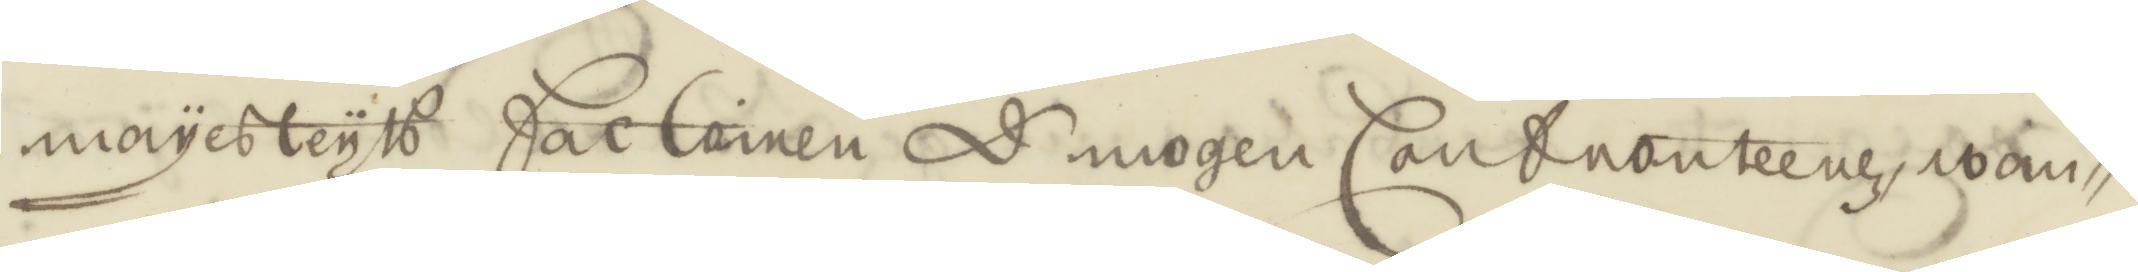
maijesteijts factoiren te mogen Confronteeren wan„
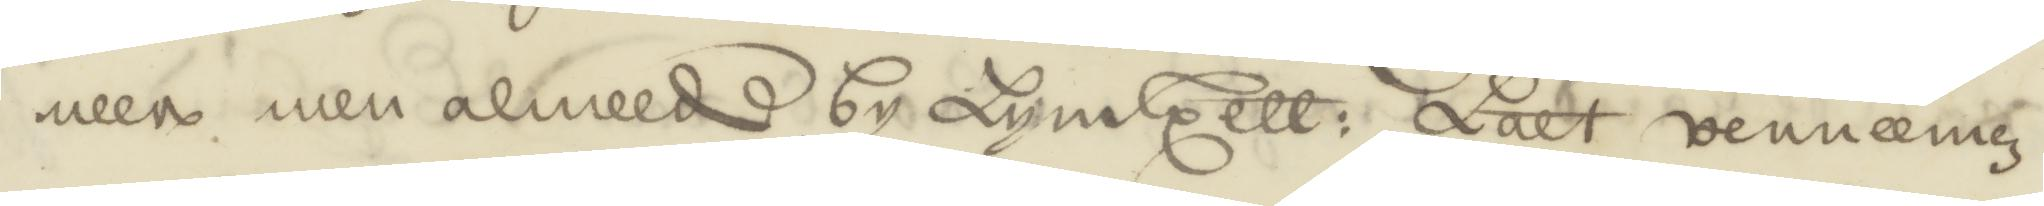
neer men almeede by zyn Exell: Laet verneemen
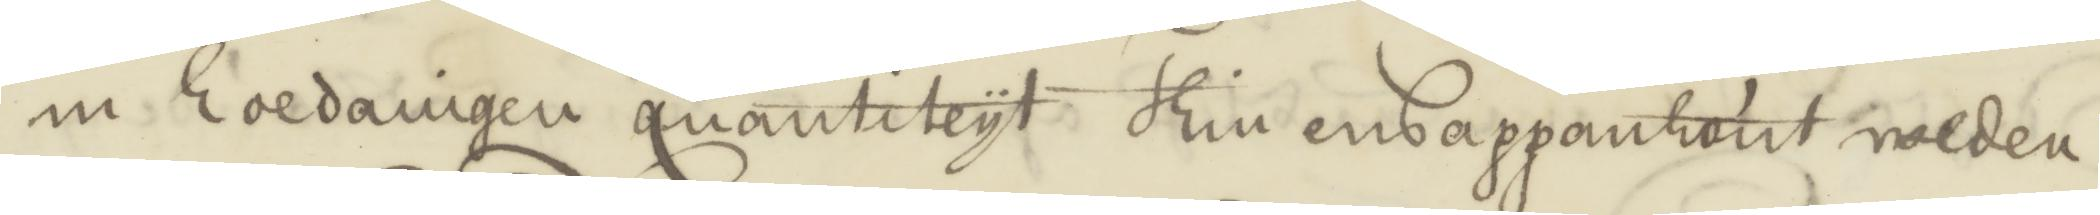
in hoedanigen quantiteijt thin en sappanhout weder
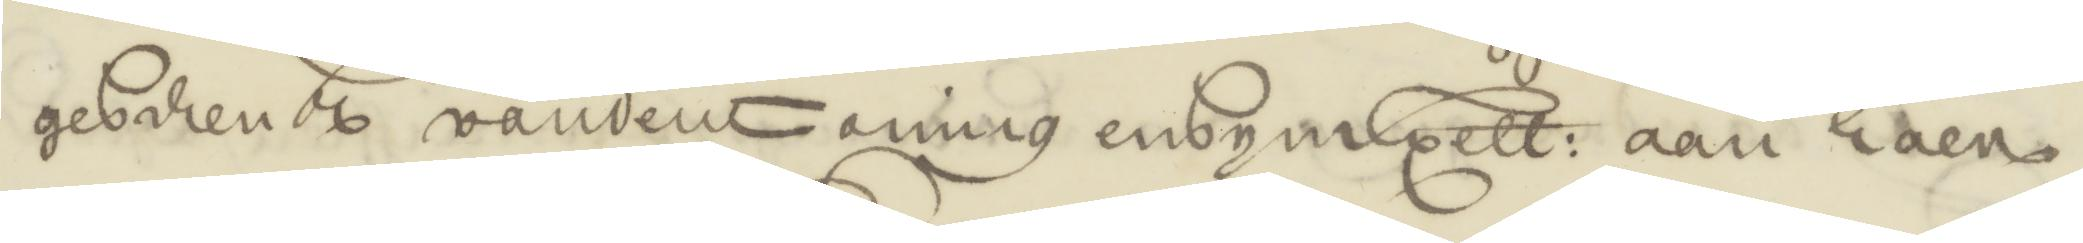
geschenk vanden coning en syn Exell: aan haer
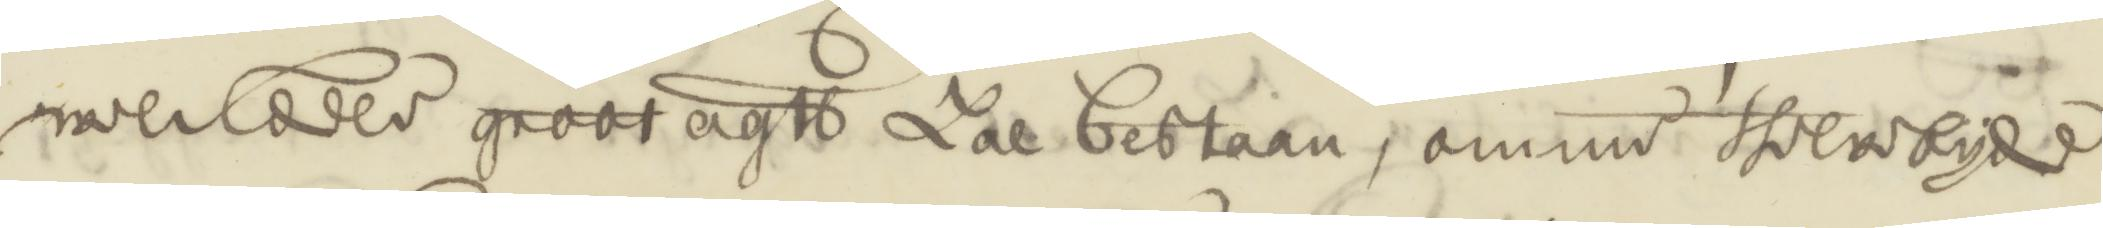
wel Edele groot agtb zal bestaan, omme 'tselve bijde
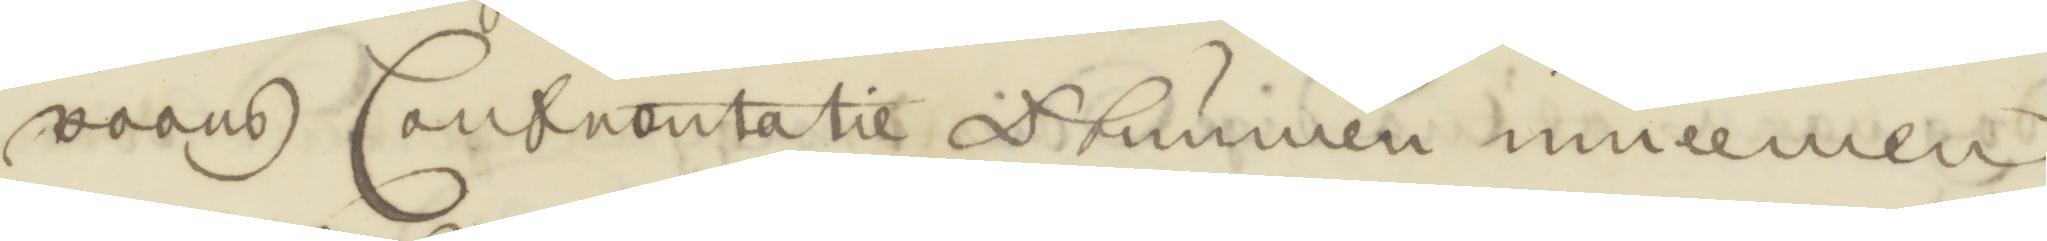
voors Confrontatie te kunnen inneemen
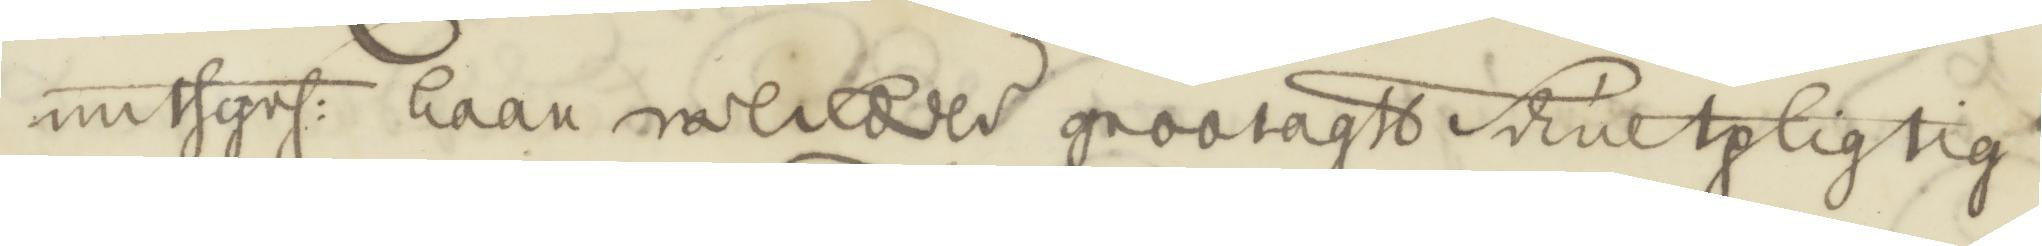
mitsgrs: haar wel Edele groot agtb schultpligtig
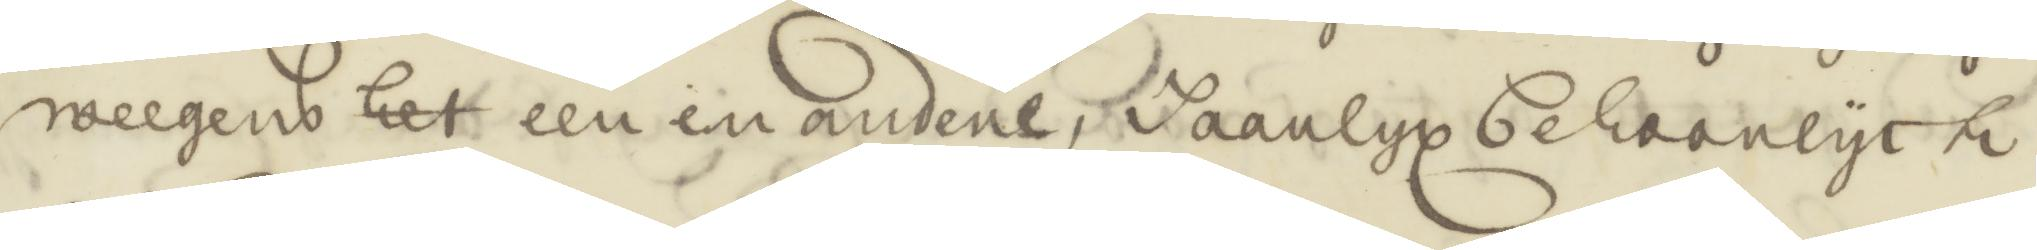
weegens het een en andere, Jaarlyx behoorlijck
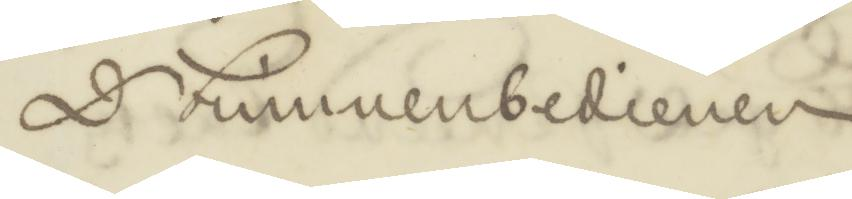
te kunnen bedienen
